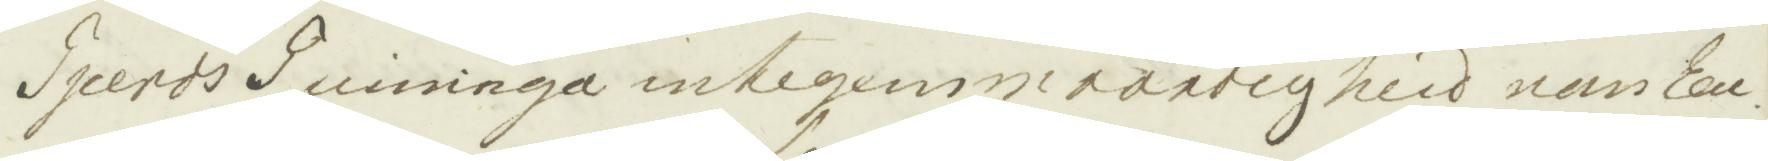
Tjeerds Tuininga in tegenswoordigheid van Eeu„
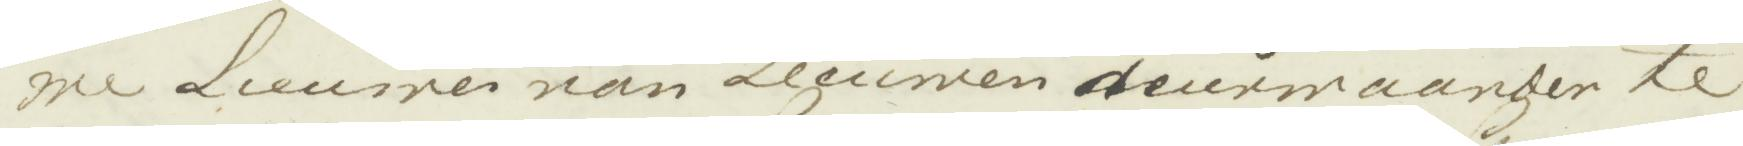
we Lieuwes van Leeuwen deurwaarder te
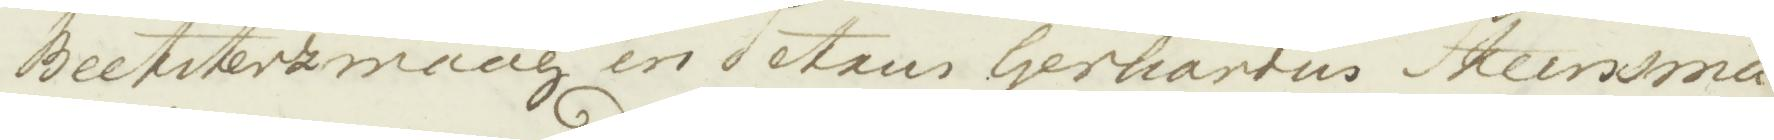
Beetsterzwaag en Petrus Gerhardus Heersma
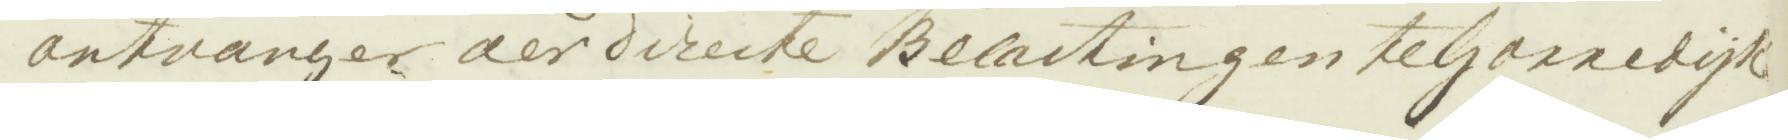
ontvanger der directe Belastingen te Gorredijk
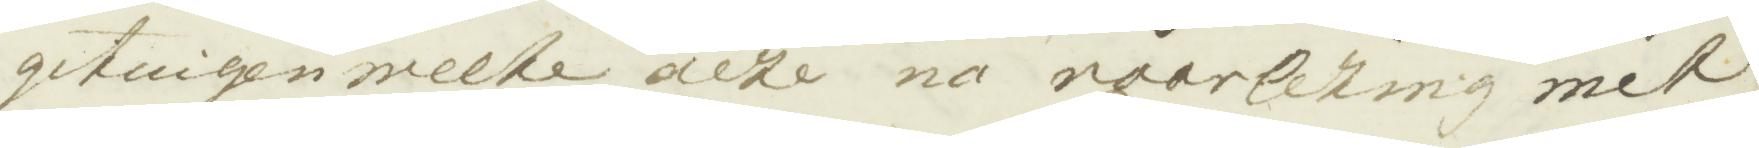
getuigen welke deze na voorlezing met
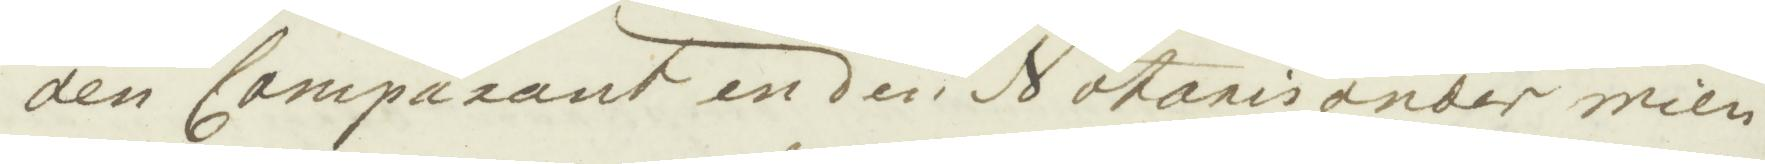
den Comparant en den Notaris onder wien
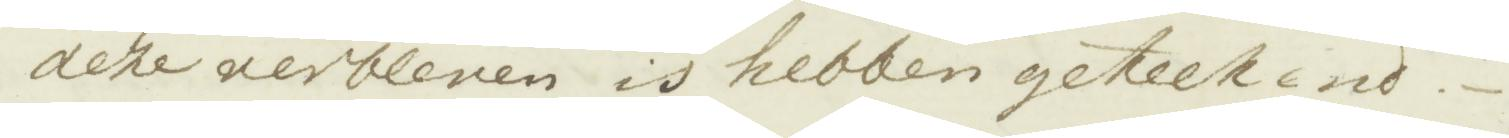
deze verbleven is hebben geteekend.-
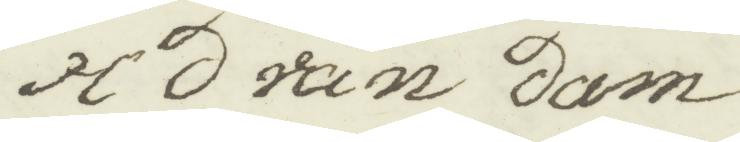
H d van dam
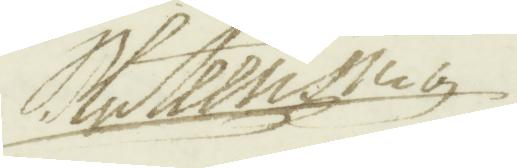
PGHeersma
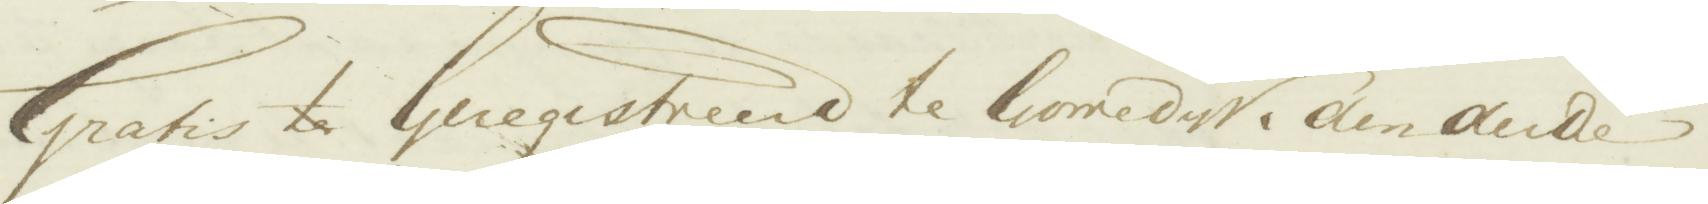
Gratis te Geregistreerd te Gorredyk den derde
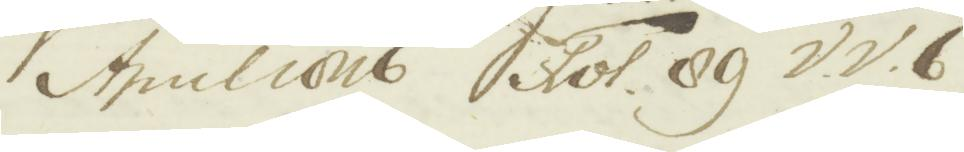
April 1816 Fol. 89 V. V. 6
